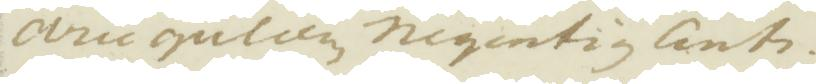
drie gulden Negentig Cents.
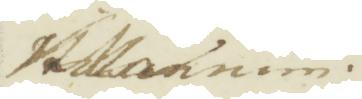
A Wansum.
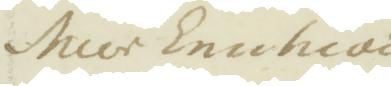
Mevr Enschedé
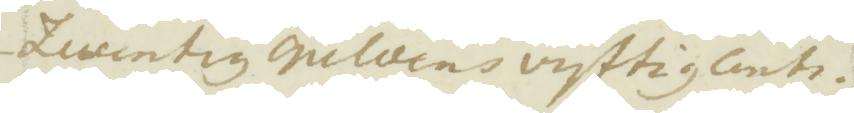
Zeventig guldens vyftig Cents.
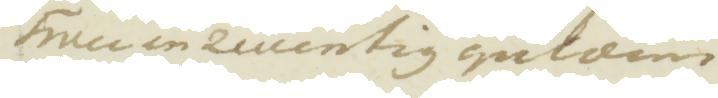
Twee en zeventig guldens
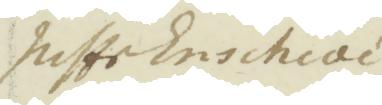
Juffr Enschedé
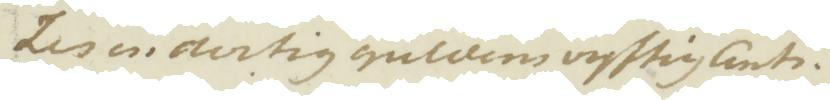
Zes en dertig guldens vyftig Cents.
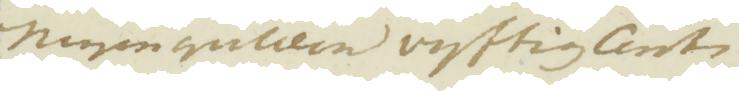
Negen gulden vyftig Cents
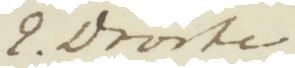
I. Droste
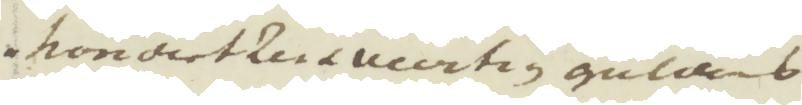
hondertZes en veertig guldens
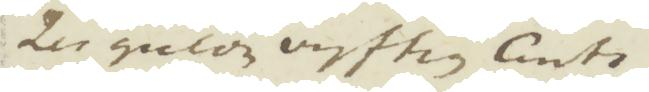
Zes gulden vyftig Cents
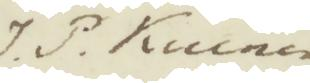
I. P. Kuinen
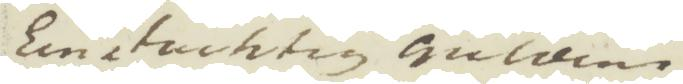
Een en tachtig guldens
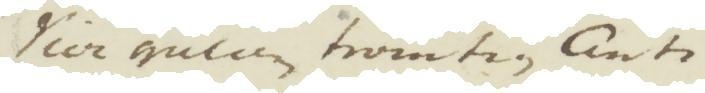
Vier gulden twintig Cents
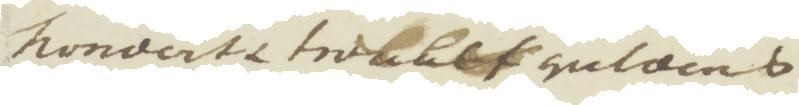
hondert en twaalf guldens
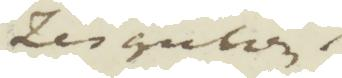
Zes gulden
